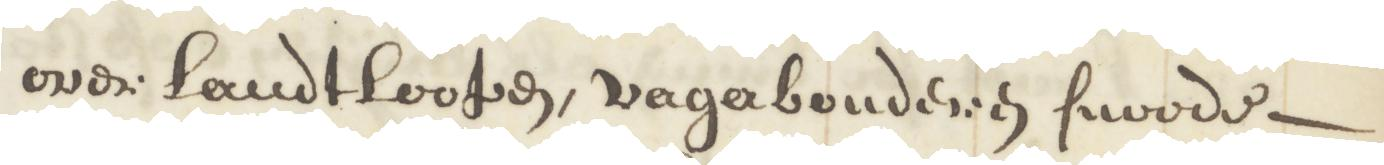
over landtloopen, vagabonderen snoode —
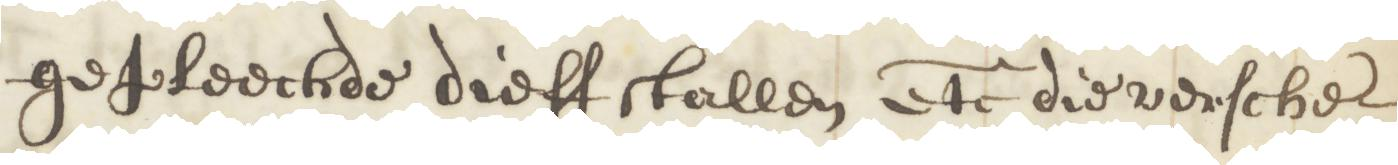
gepleechde dieff stallen etc dieversche
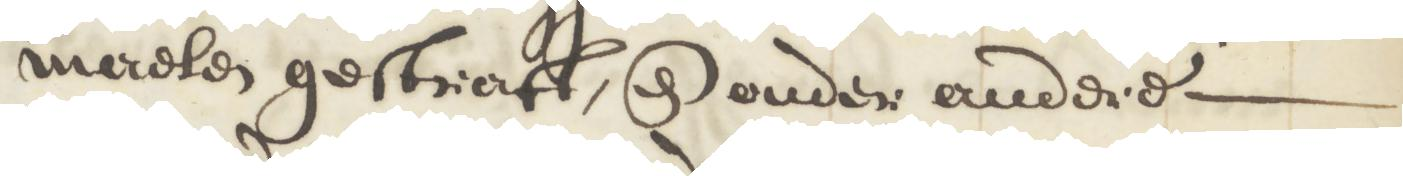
maelen gestraft, ende onder andere —
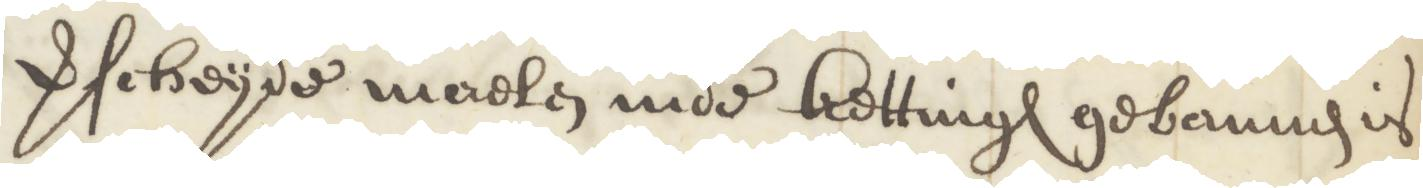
verscheijde maelen inde kettingh gebannen is
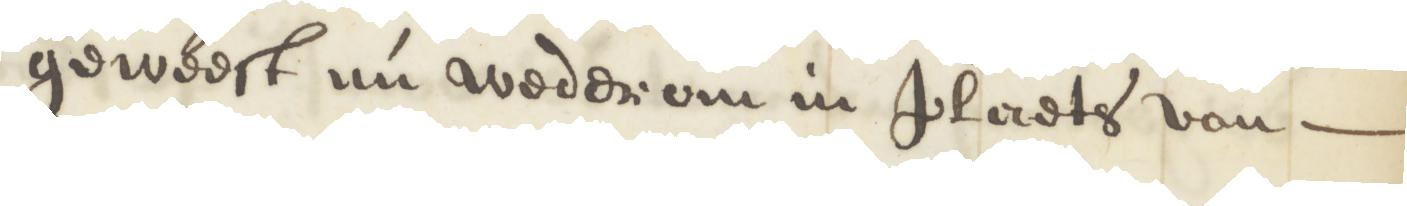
geweest nu weder om in plaets van —
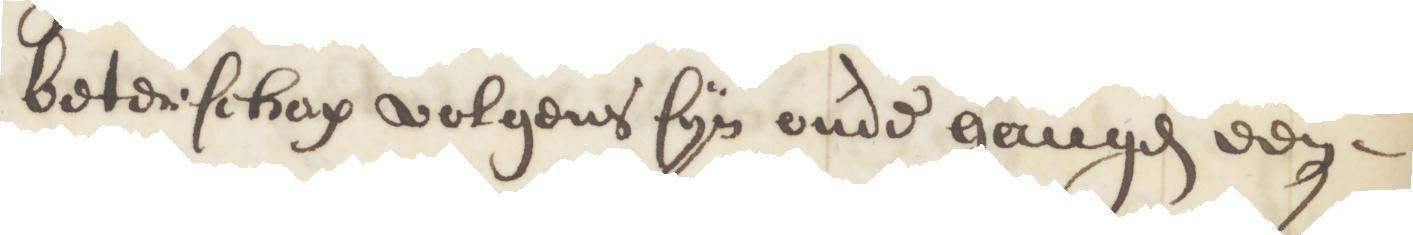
beterschap volgens sijn oude gangen een —
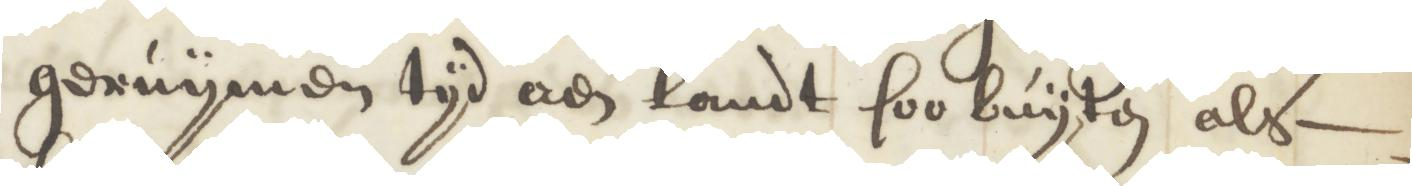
geruijmen tijd aen landt soo buijten als —
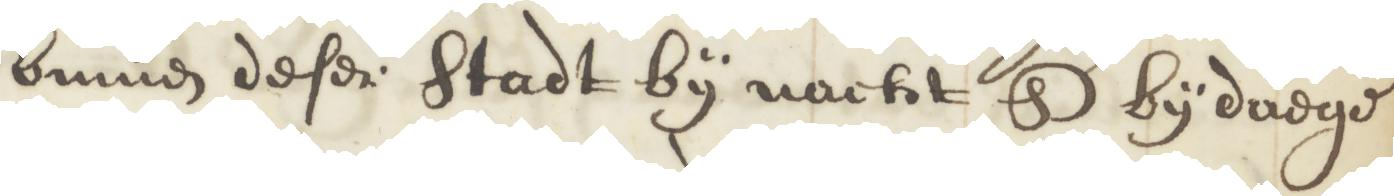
binnen deser stadt bij nacht ende bij daege
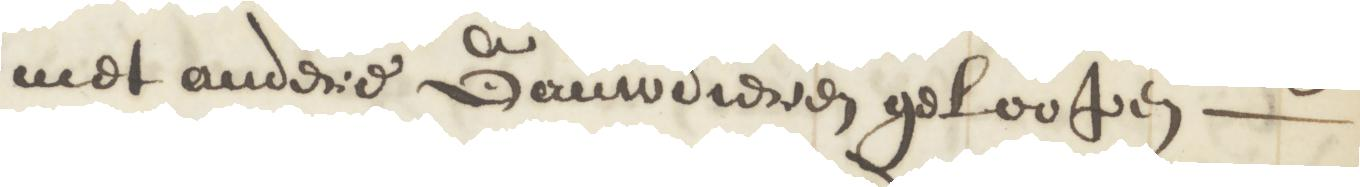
met andere Gauwdieven geloopen —
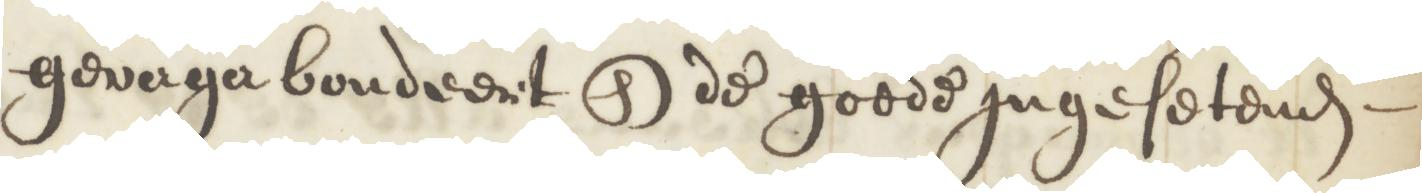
gevagabondeert ende de goede jngesetenen —
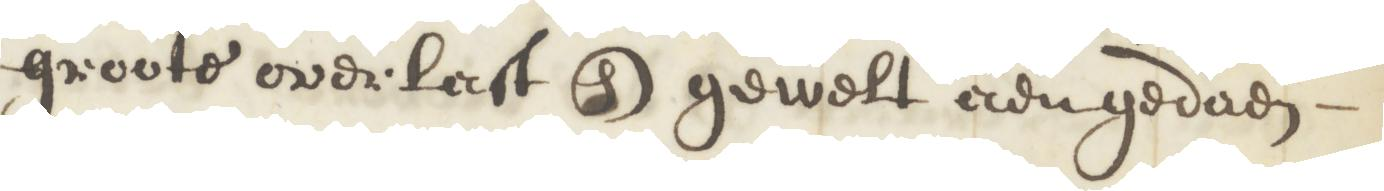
groote over last ende gewelt aen gedaen —
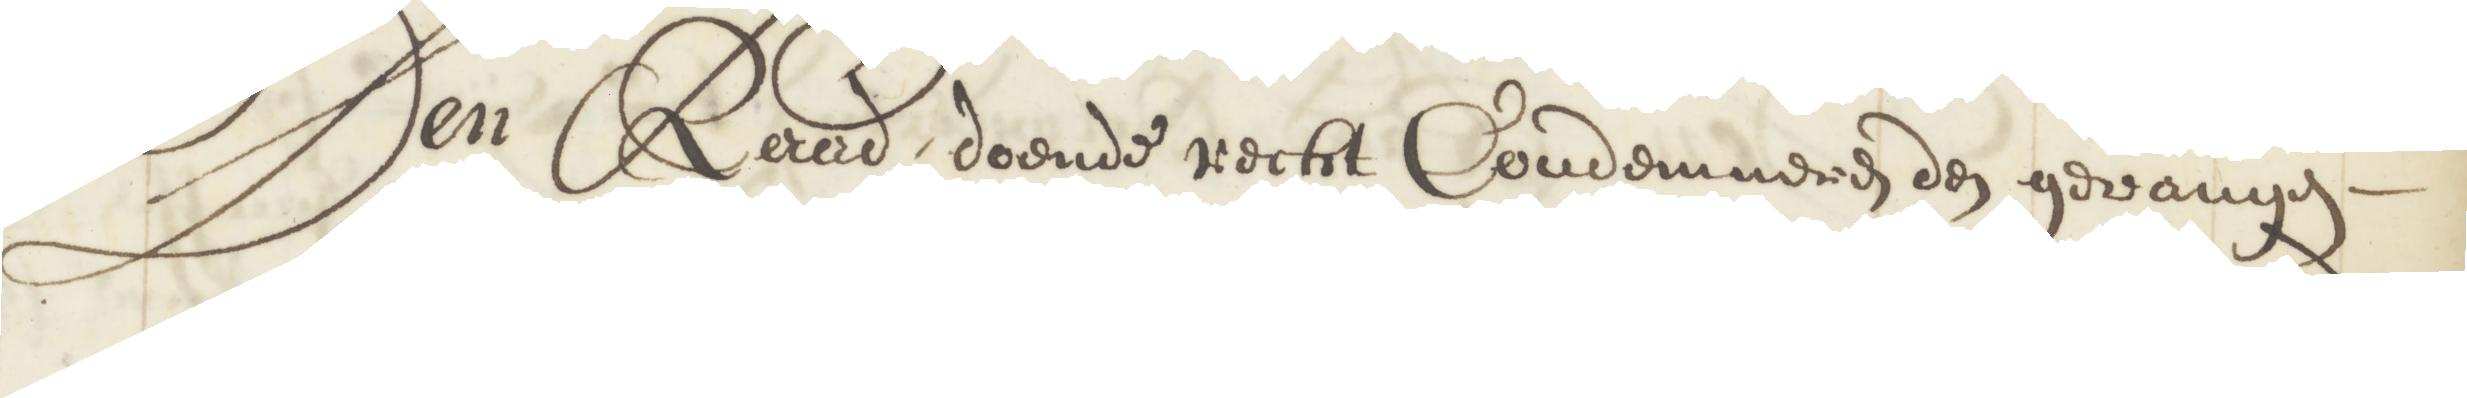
Den Raad, doende recht Condemneren den gevangen —
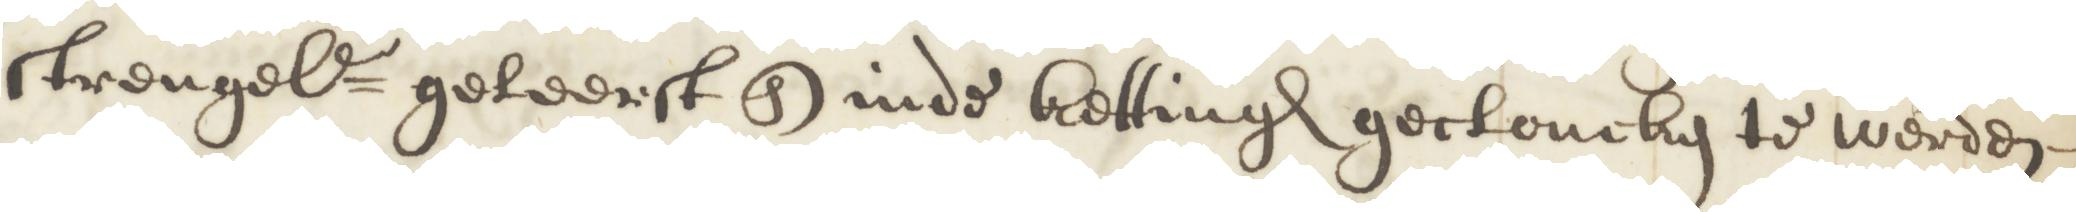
strengelijk geleerst ende kettingh gecloncken te werden —
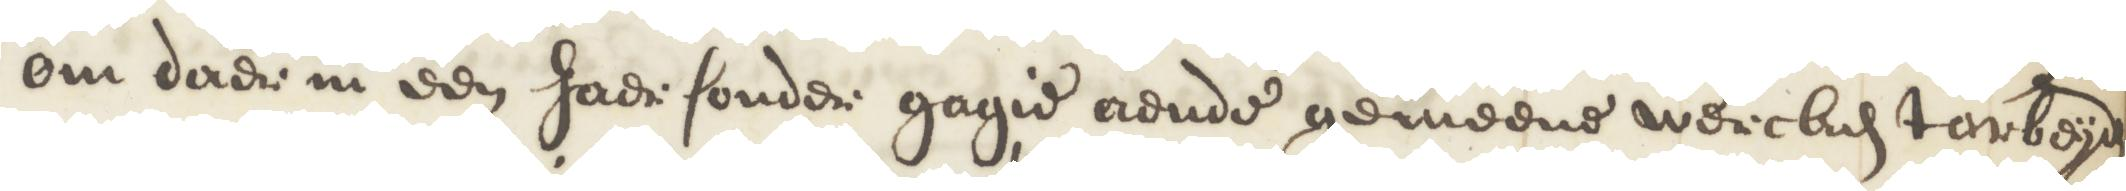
om daer in een Jaer sonder gagie aende gemeene wercken t arbeijden
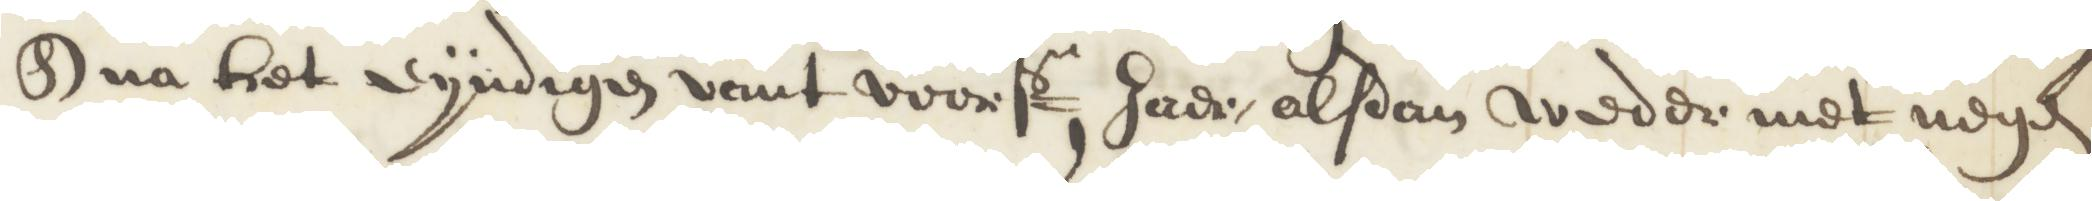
ende na het eijndigen vant voorꞵ=e Jaer, alsdan weder met negen
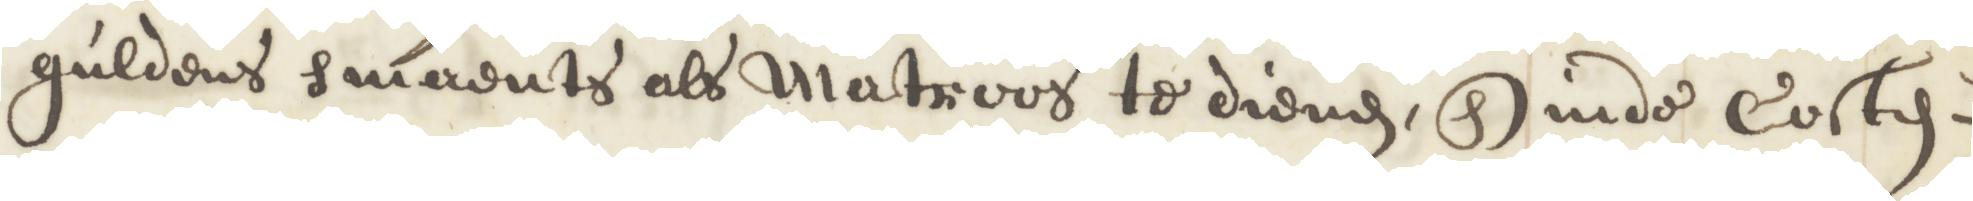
guldens smaents als Matroos te dienen, ende inde Costen
